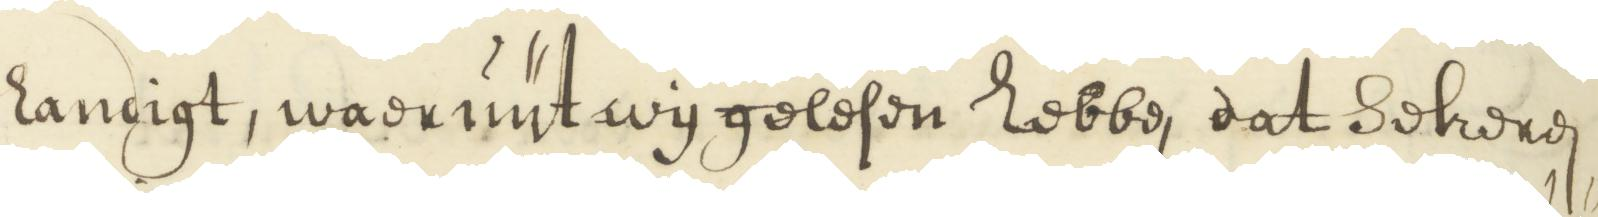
handigt, waeruijt wij gelesen hebbe, dat sekeren
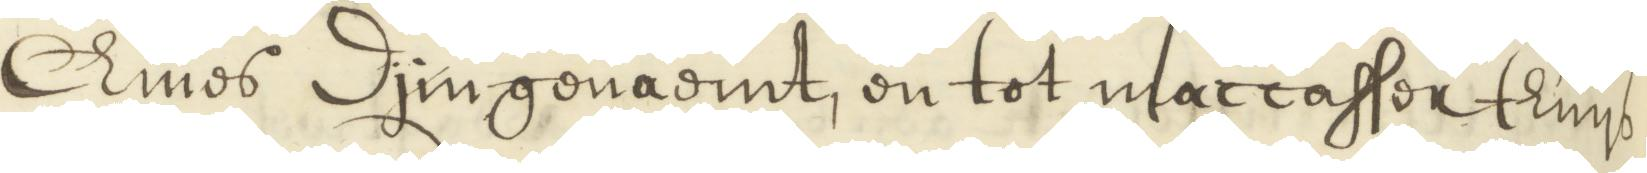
Chines Ejin genaemt, en tot maccasser thuijs
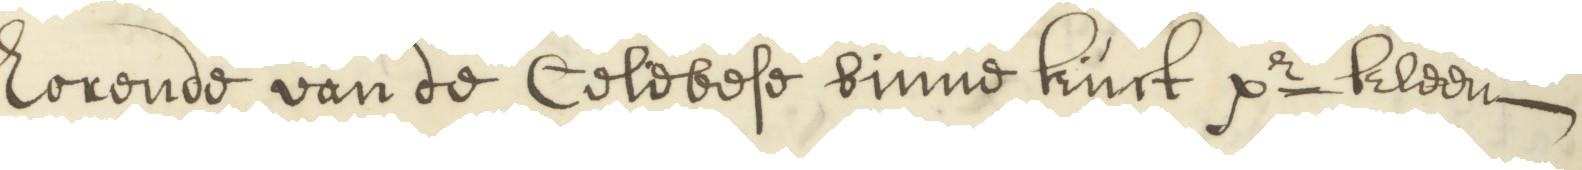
horende van de Celebese binne kust p=r kleen
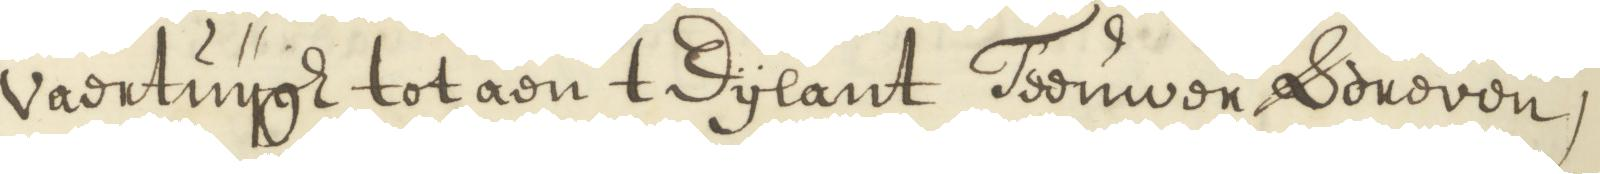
vaertuijgh tot aen ’t Eijlant Teeuwer verdreven,
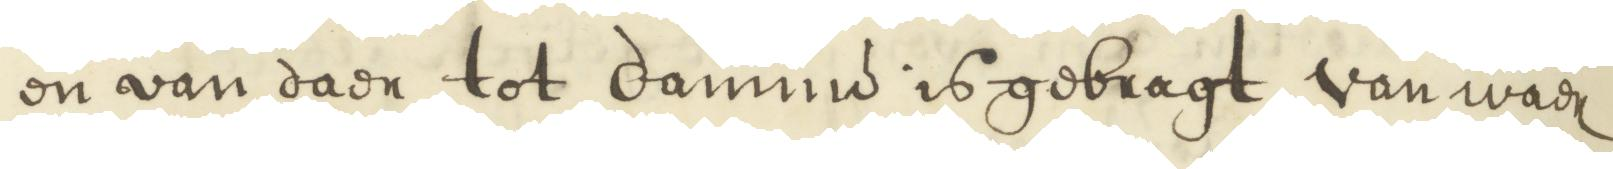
en van daer tot damme is gebragt, van waer
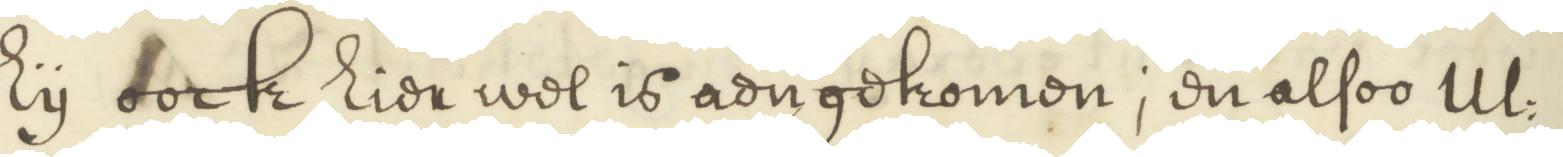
hij oock hier wel is aengekomen; en alsoo Ul:
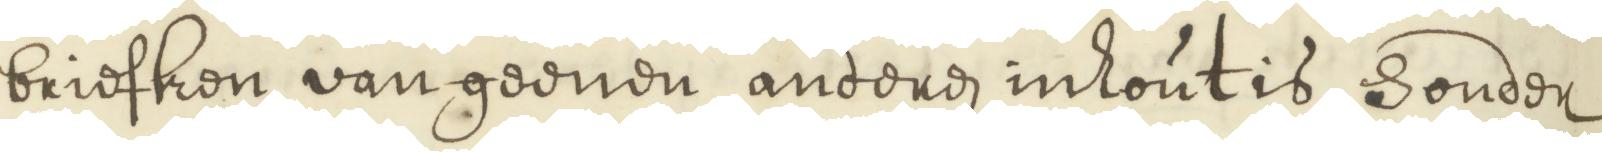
briefken van geenen anderen inhout is, sonder
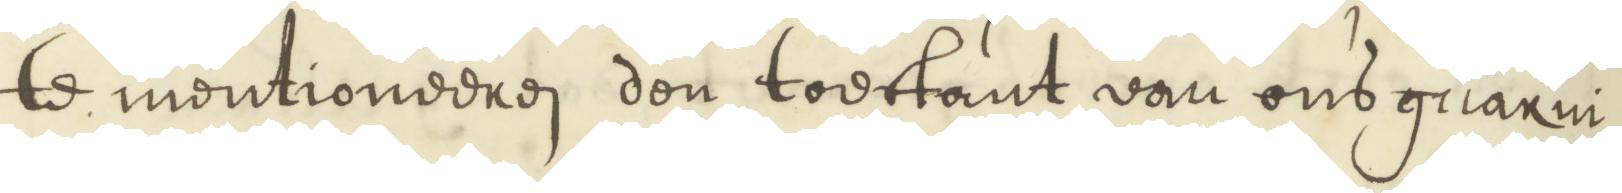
te mentioneeren den toestant van ons guarni
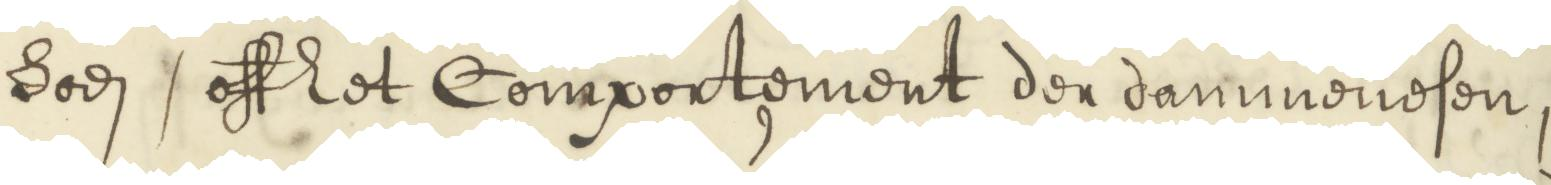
soen / off het Comportement der dammenesen,
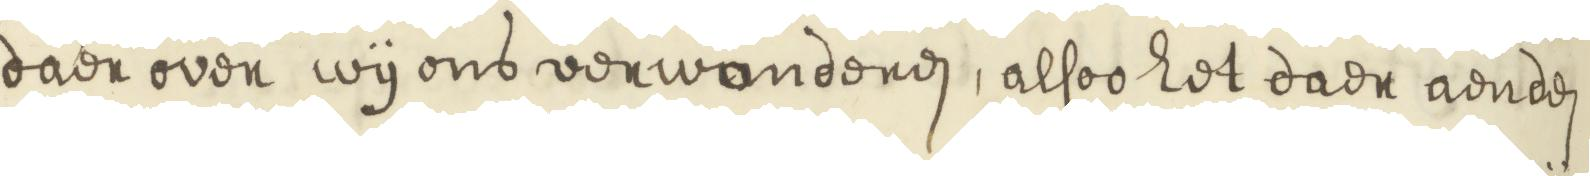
daer over wij ons verwunderen, alsoo het daer aen den
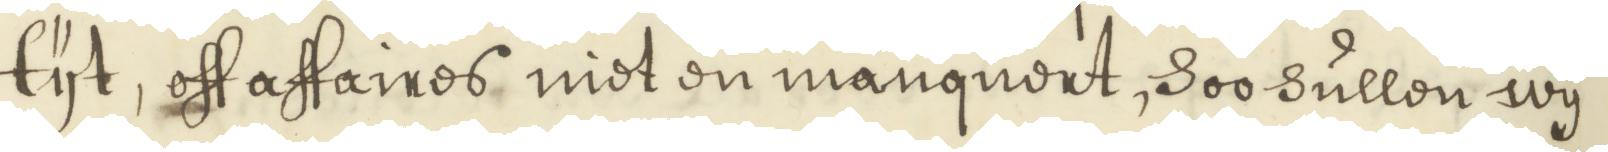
tijt, off affaires niet en manquert, soo sullen wij
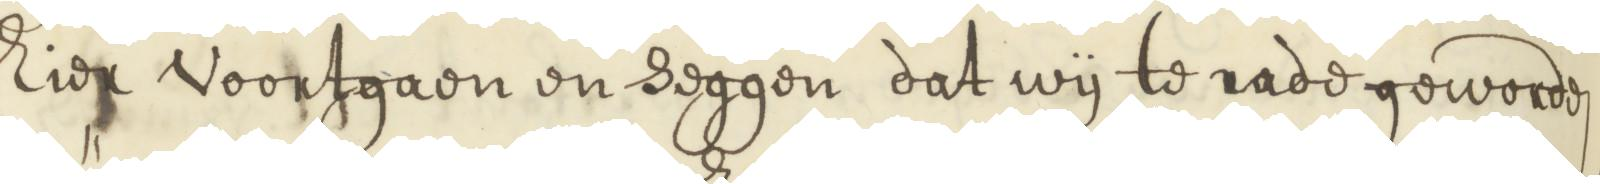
hier voortgaen en seggen dat wij te rade geworden
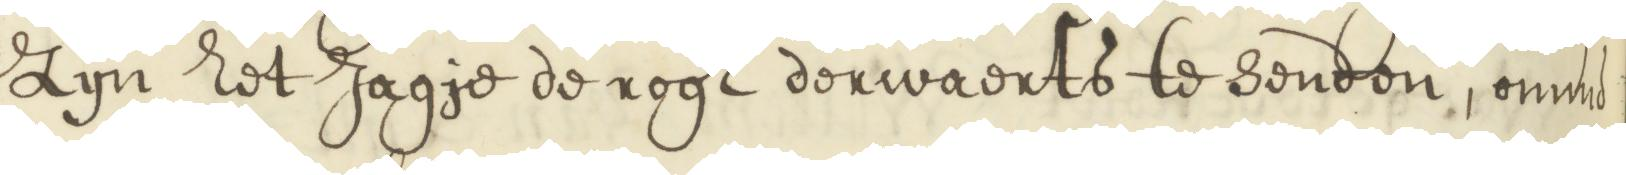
zijn het Jagje de rogh derwaerts te senden, omme
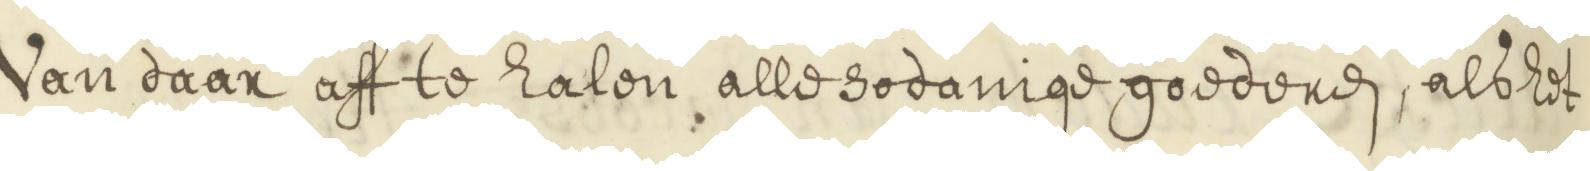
Van daar aff te halen alle sodanige goederen, als het
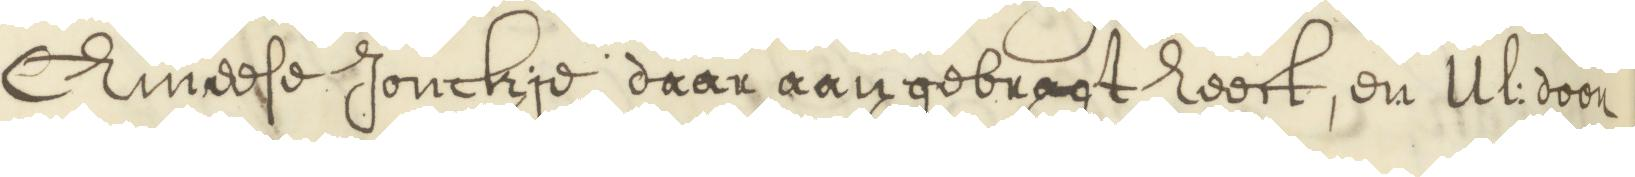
Chineese Jonckje daar aangebragt heeft, en Ul: door
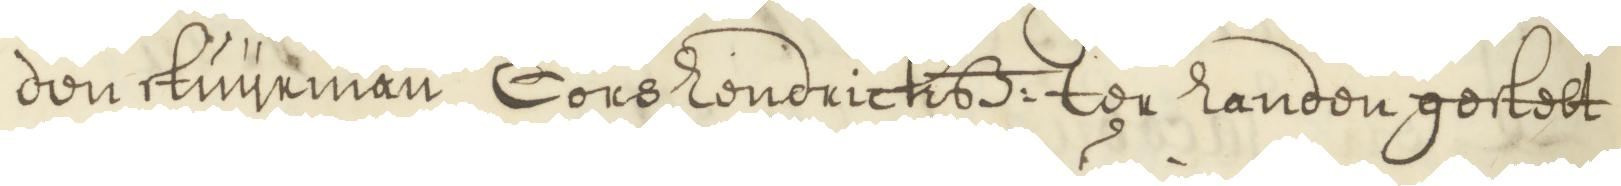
den stuijrman Cors hendricksz: ter handen gestelt
